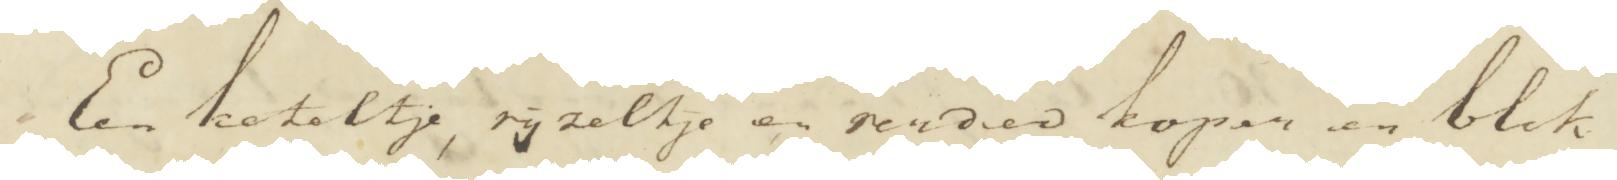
Een keteltje, vijzeltje en verder koper en blik
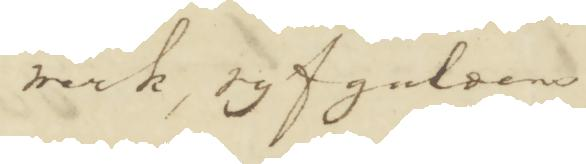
werk, vijf guldens
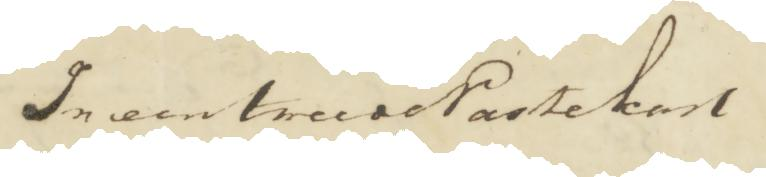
In een tweede Vaste kast
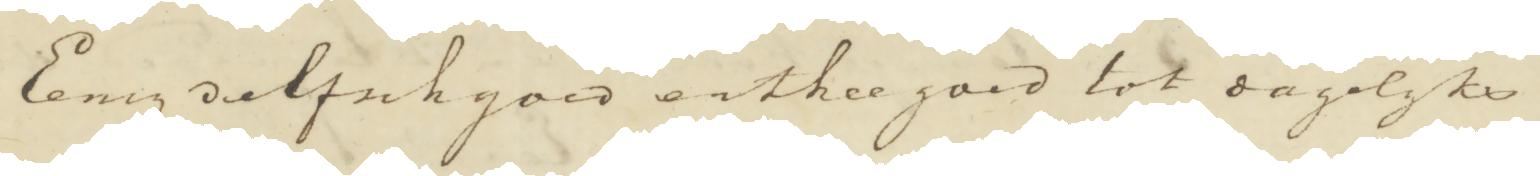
Eenig delftsch goed en thee goed tot dagelyks
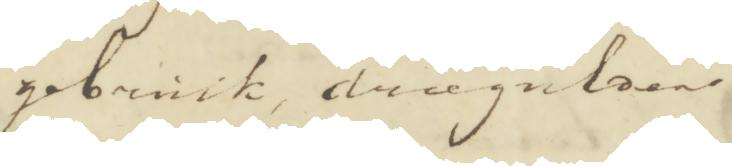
gebruik, drie guldens
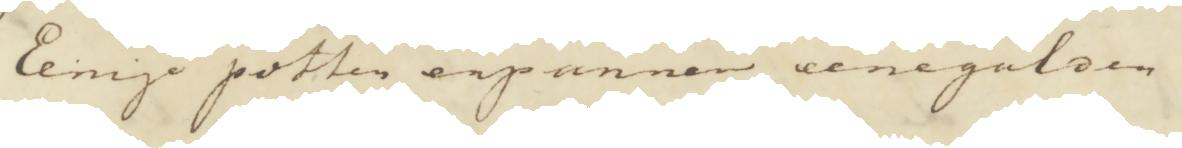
Eenige potten en pannen, een gulden
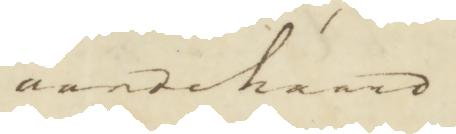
aan de haard
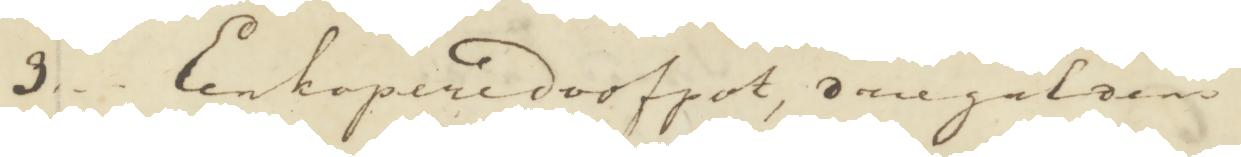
3, — — Een kopere doofpot, drie guldens
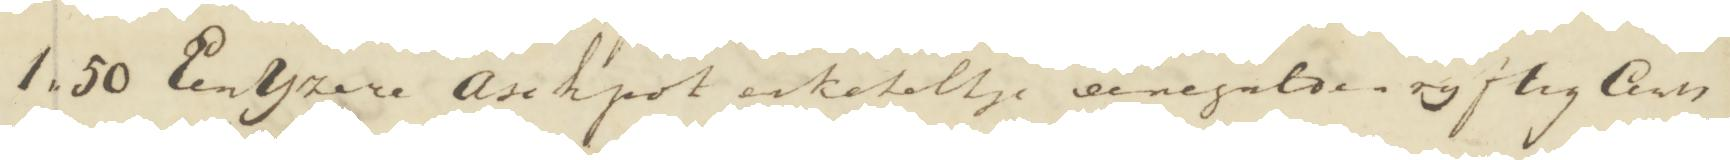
1„50 Een Yzere Aschpot en keteltje eene gulden vijftig Cents
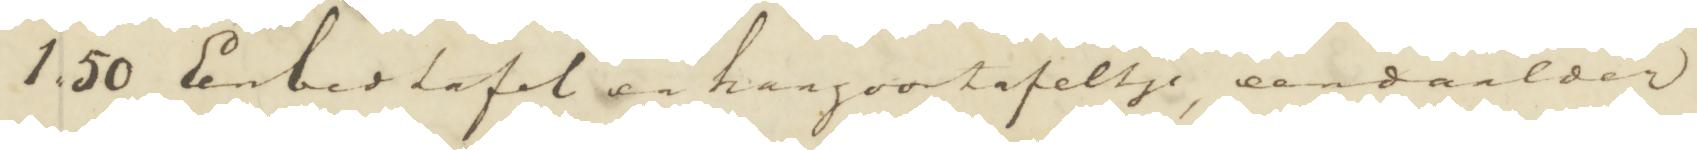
1„50 Een bed tafel, en hangoortafeltje, een daalder
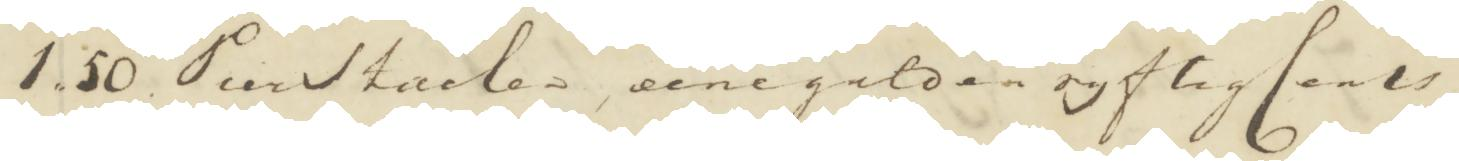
1„50 Vier stoelen, ene gulden vyftig Cents
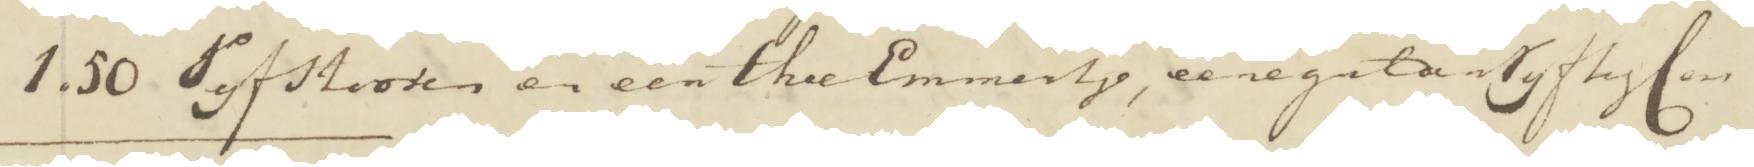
1„50 Vyf stooven en een thee Emmertje, eene gulden vyftig Cen
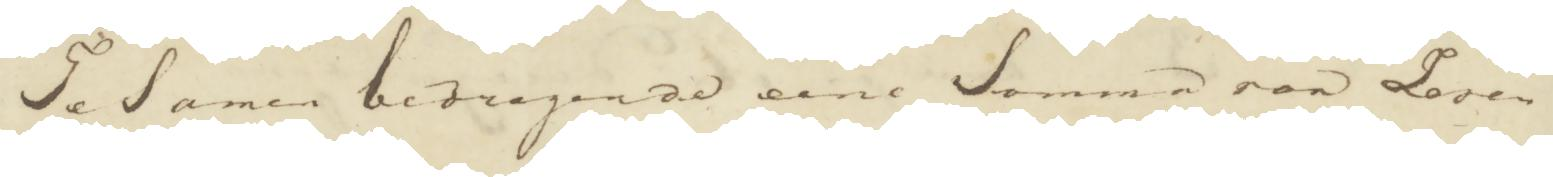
Te Samen bedragende eene Somma van Zeven
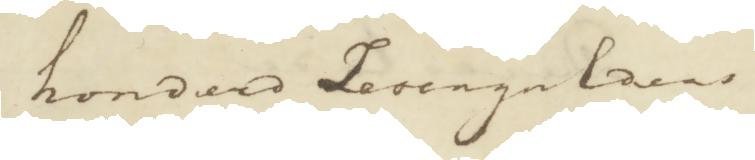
honderd Zeven guldens
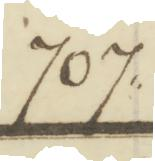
ƒ 707„
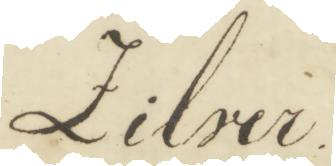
Zilver.
